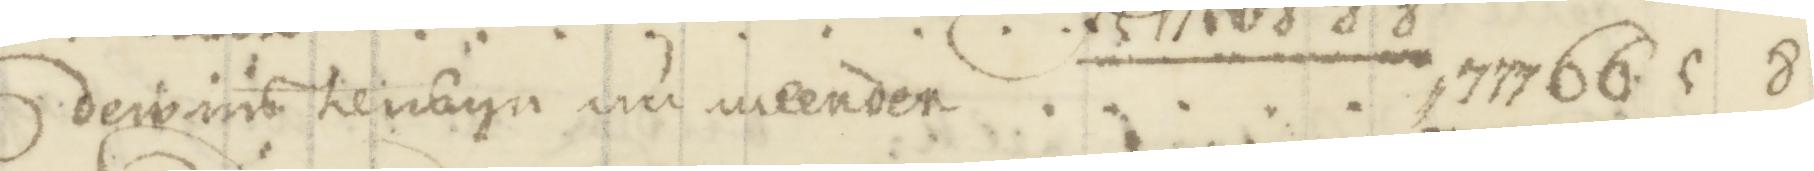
de winsten syn nu meerder . . . . . „77766 5 8
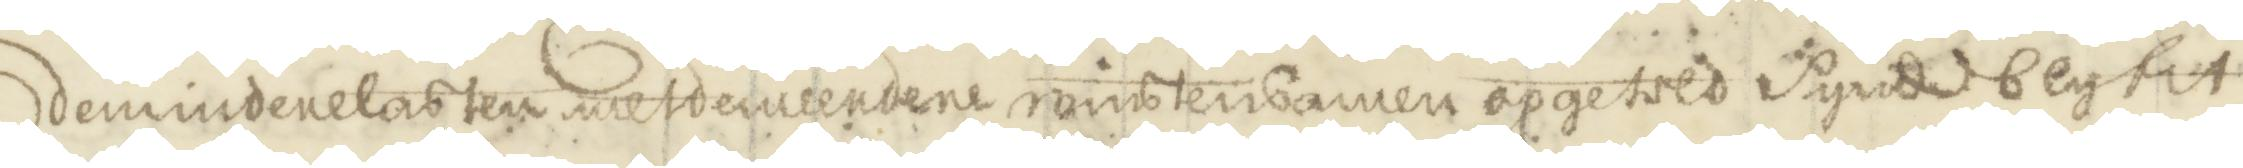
demindere lasten met de meerdere winsten samen opgeteld synde blykt
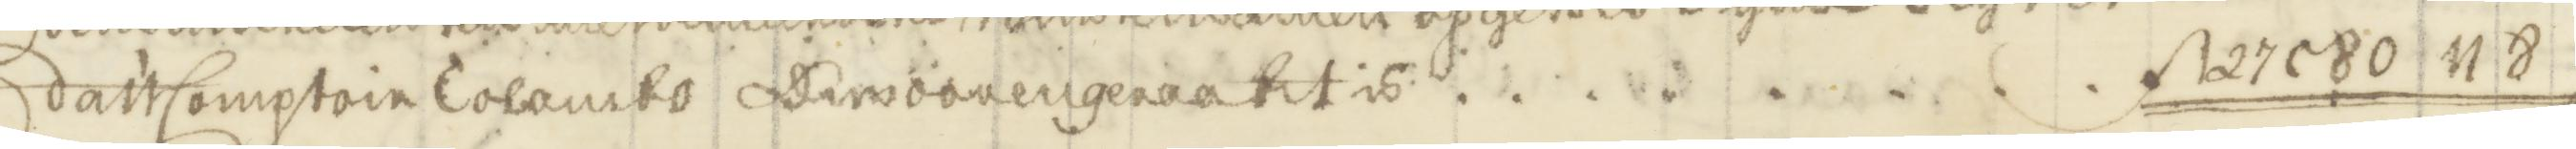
dat't Comptoir colombo tervooren geraakt is . . . . . . . . ƒ127580 11 8
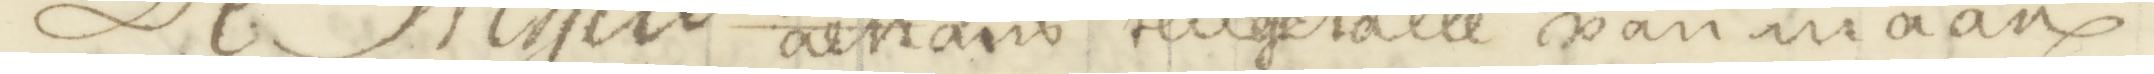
De Wissels althans ten getalle van maar
